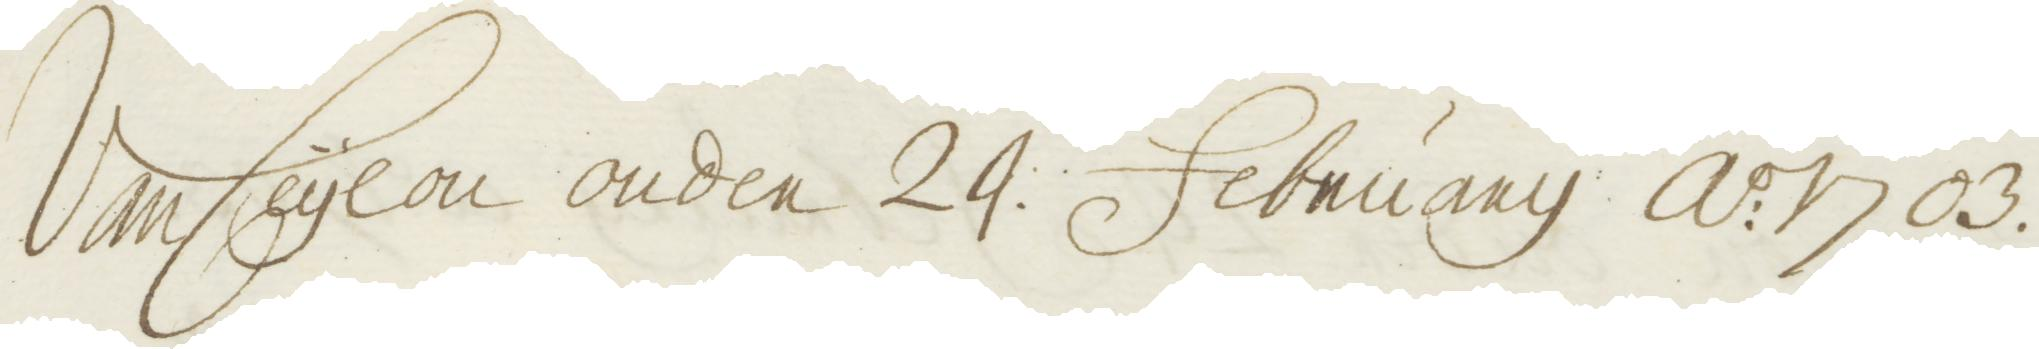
Van Ceijlon onder 24: Februarij: A:o 1703.
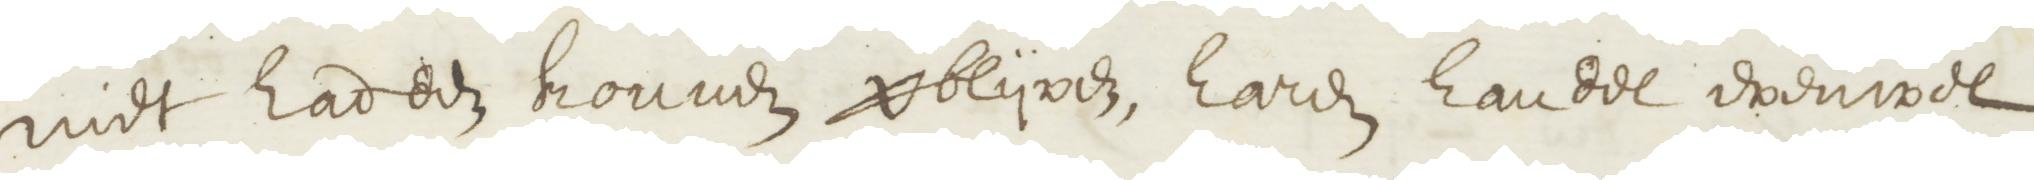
niet hadden konnen verblijven, haren handel evenwel
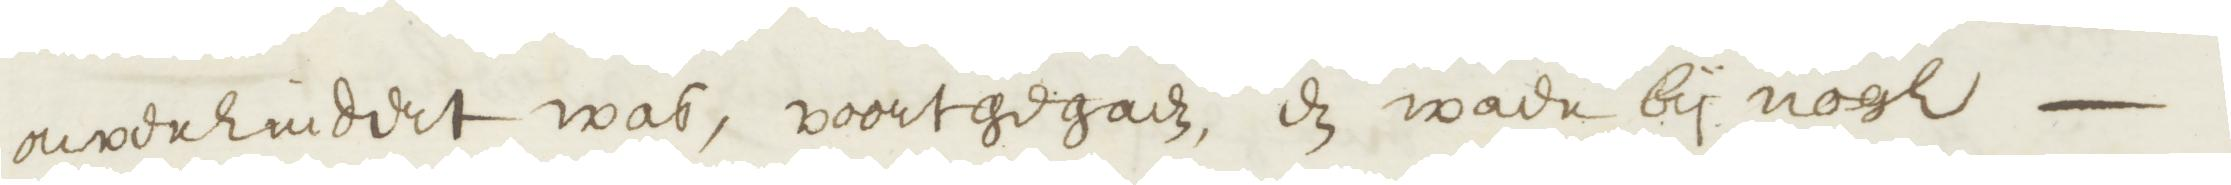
onverhindert was, voortgegaen, en waer bij nogh —
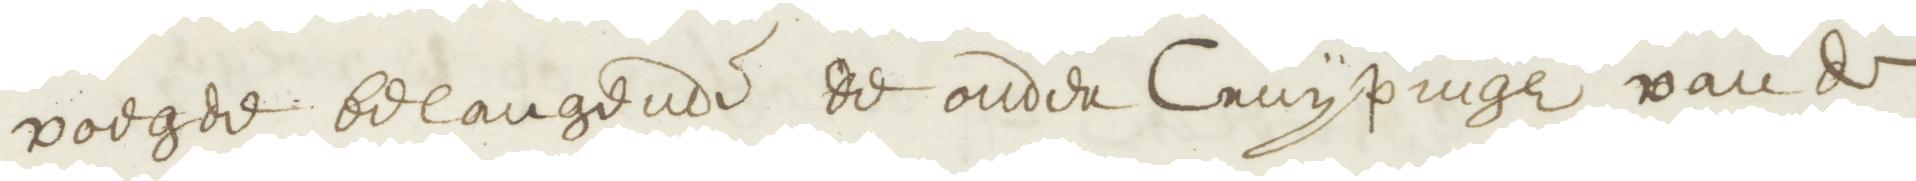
voegde belangende de onder Cruijpingh van de
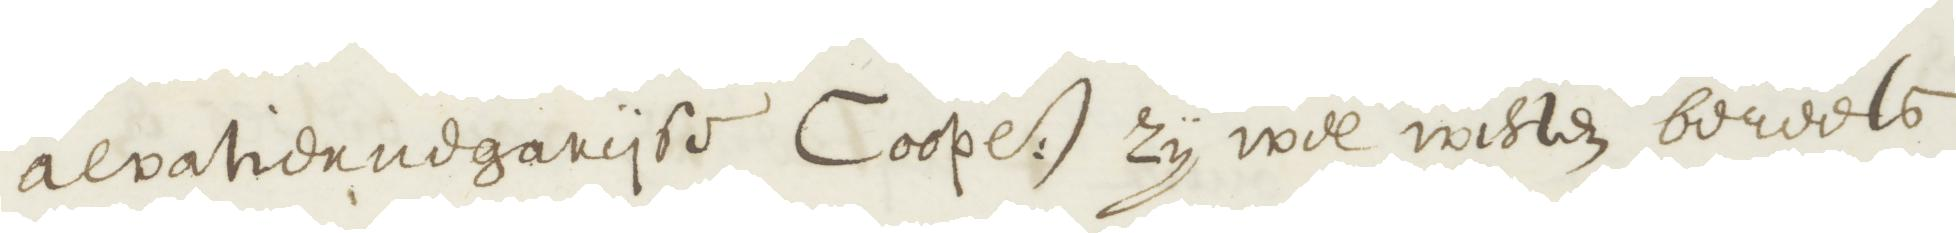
alvatier negarijse Cooplijk zij wel wisten bereets
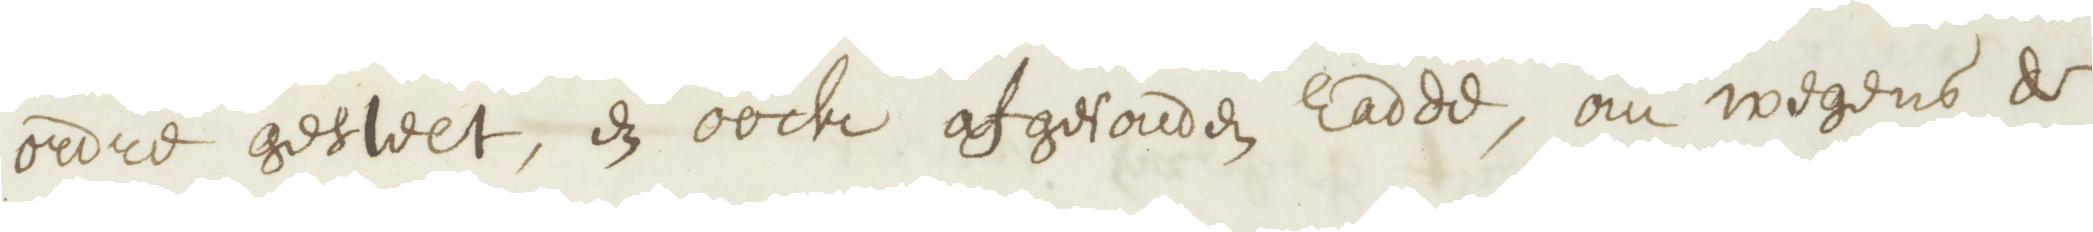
ordre gestelt, en oock afgesonden hadde, om wegens de
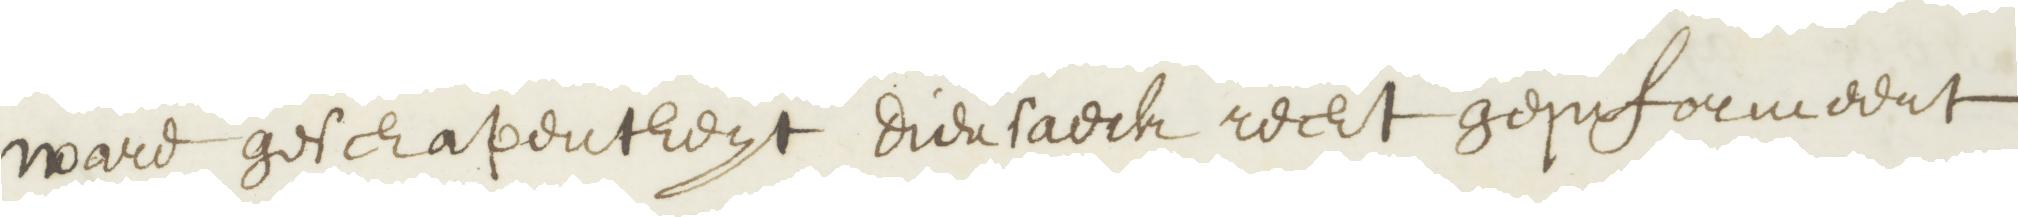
ware geschapentheijt dier saeck recht gejnformeert
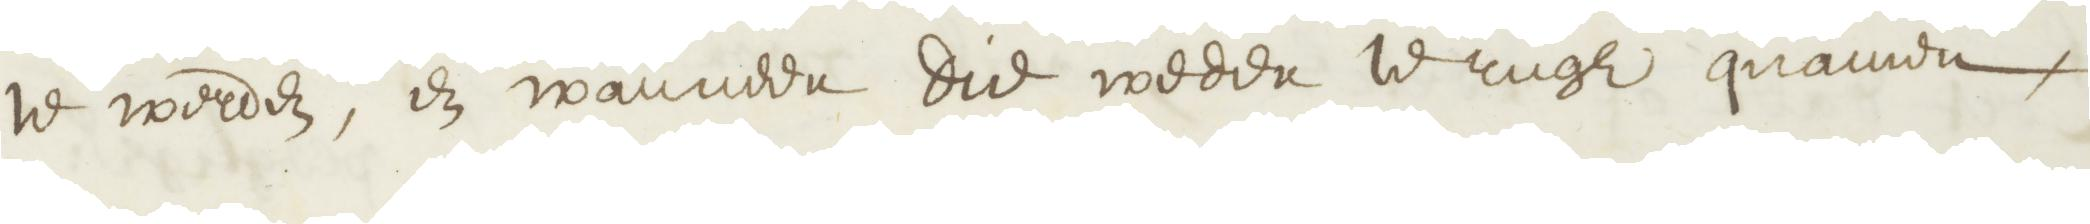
te werden, en wanneer die weder terugh quamen,
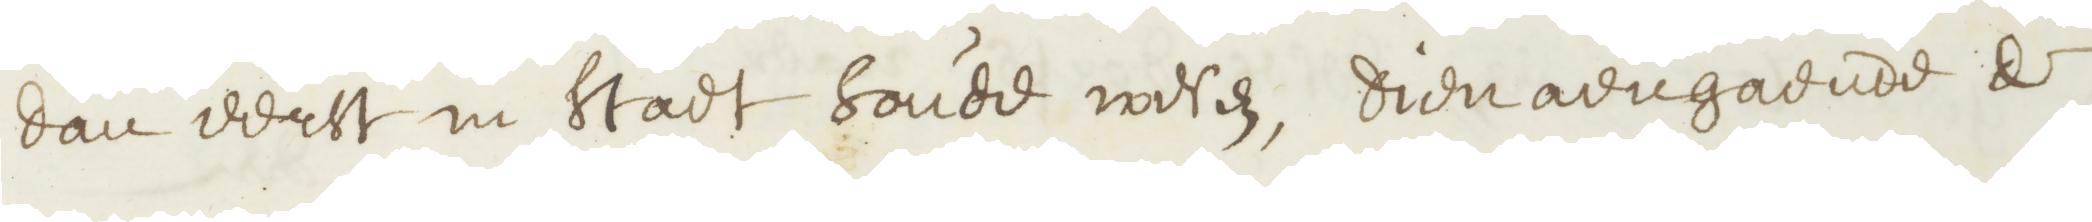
dan eerst in staet soude wesen, dien aengaende de
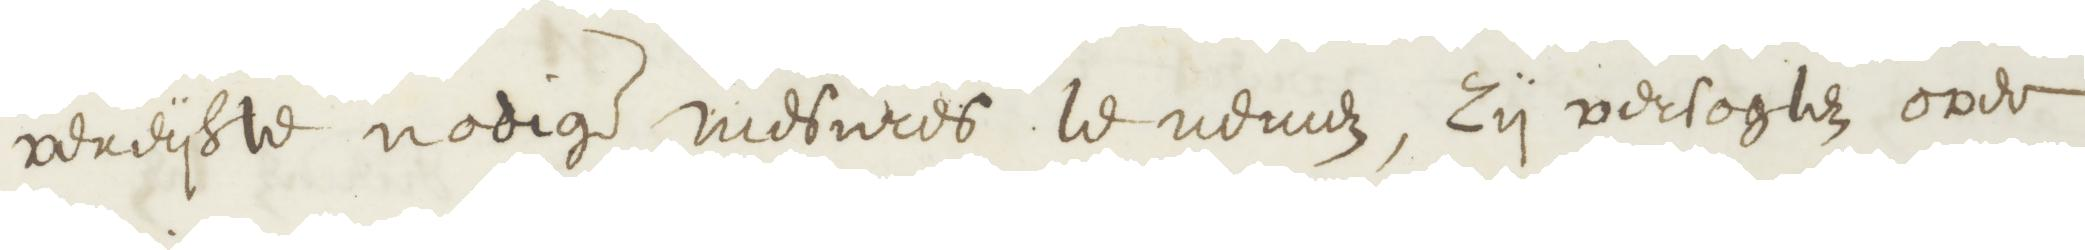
vereijste nodige mesures te nemen, zij versogten over
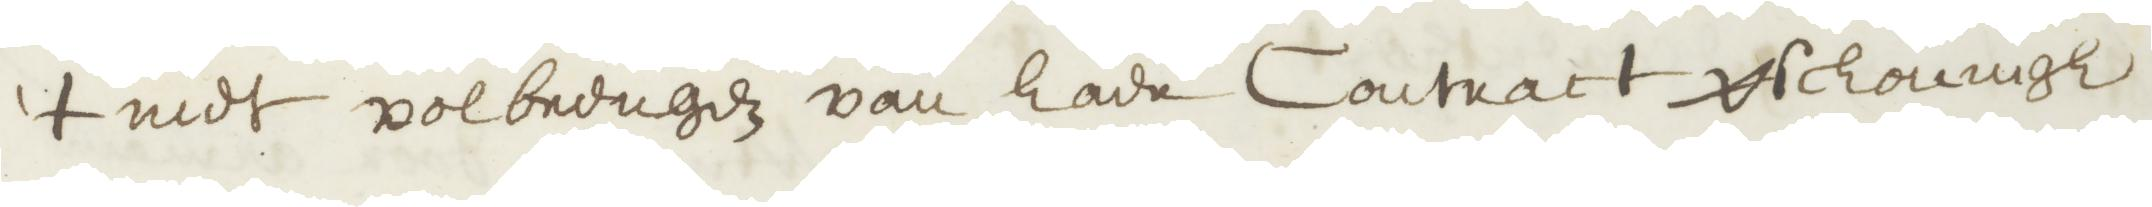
’t niet volbrengen van haer Contract verschoningh
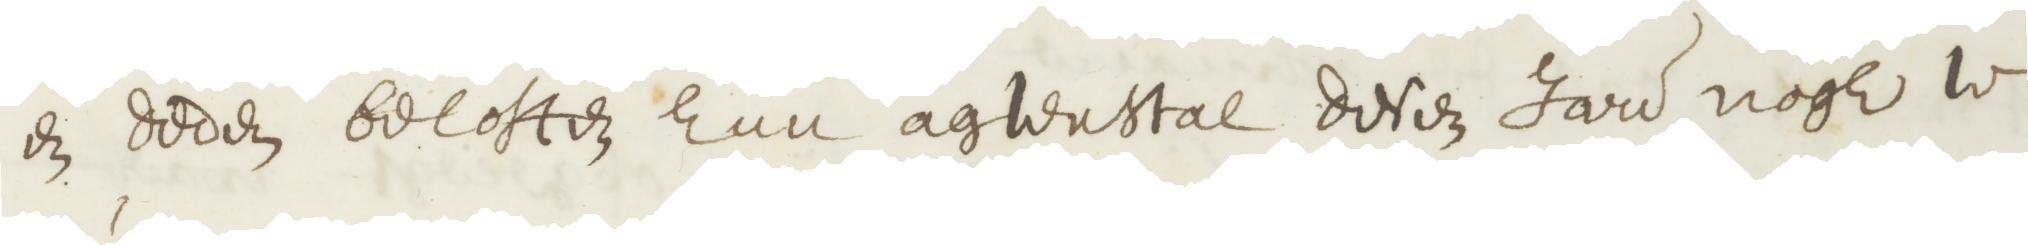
en deden beloften hun agterstal desen Iare nogh te
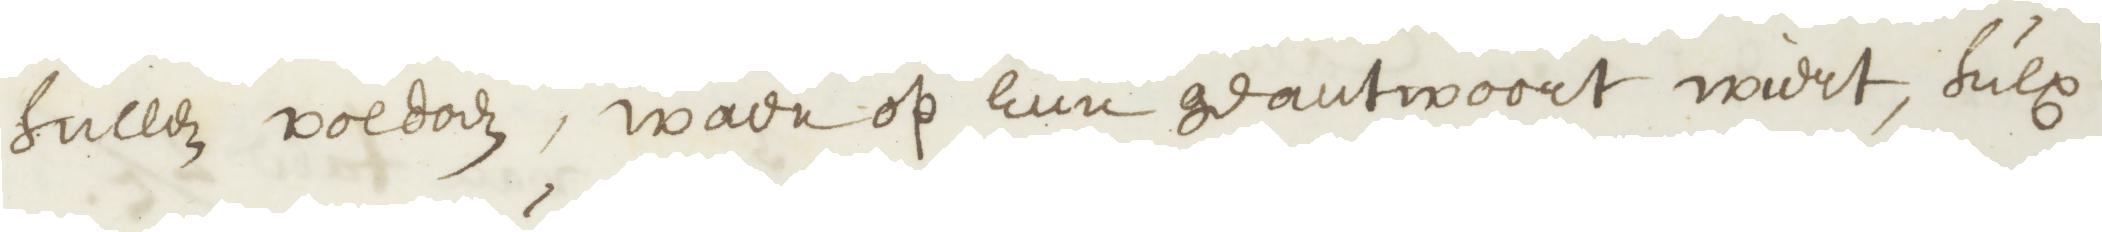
sullen voldoen, waer op hun geantwoort wiert, sulx
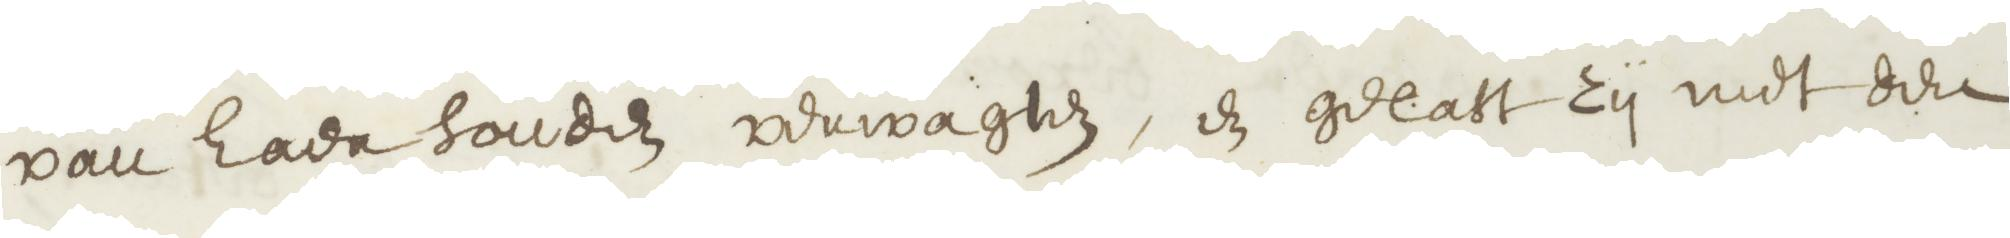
van haer souden verwagten, en gelast zij met den
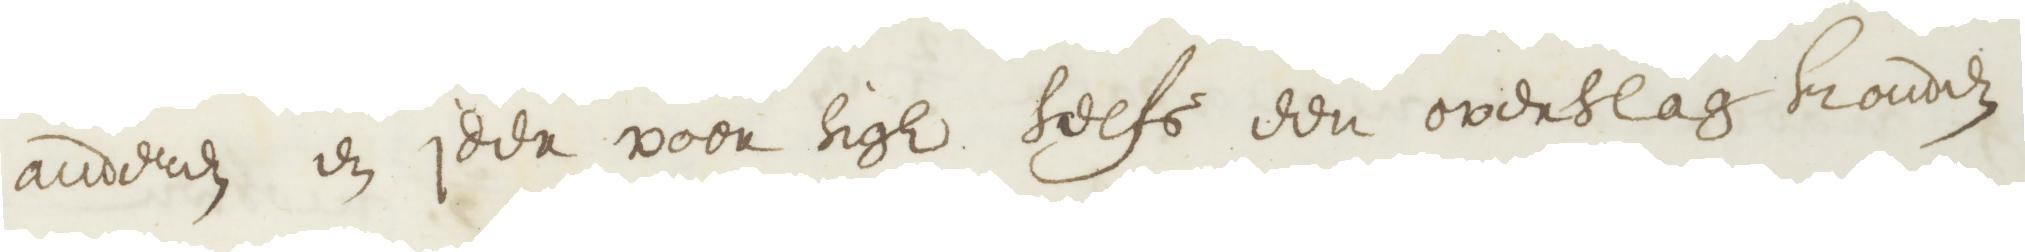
anderen en jder voor sigh selfs een overslag konden
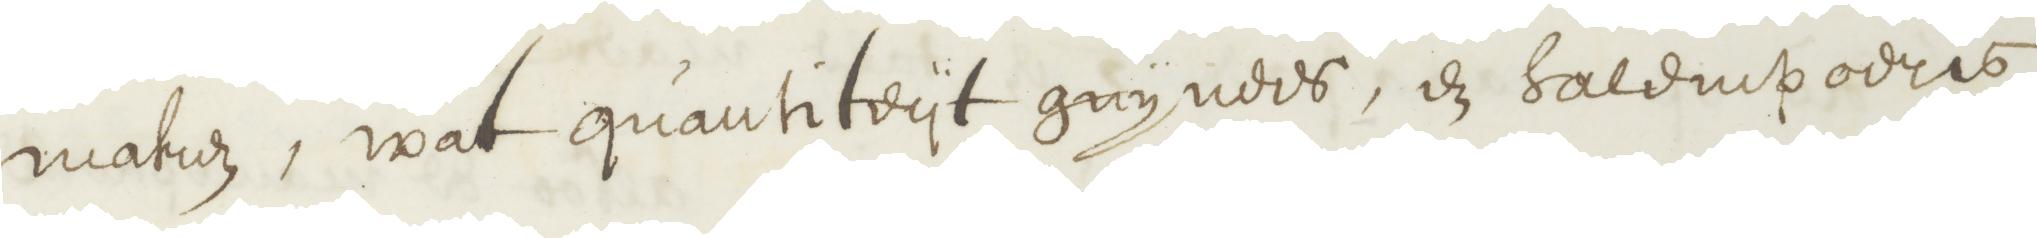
maken, wat quantiteijt guijnees, en salempoeris
